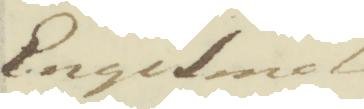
Engesmit
